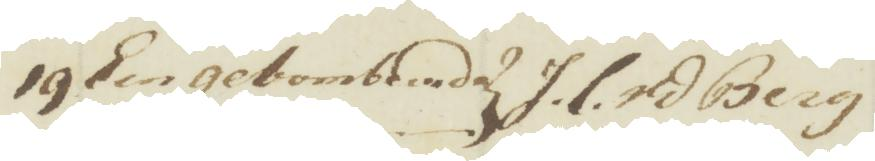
19 Een gebombeerde J. C. vd Berg
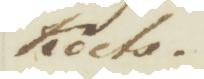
Koets.
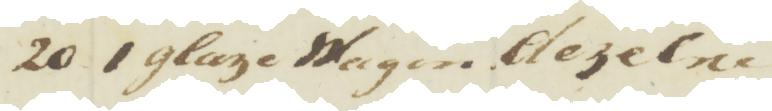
20 1 glaze Wagen dezelve
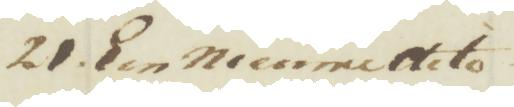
21. Een nieuwe dito
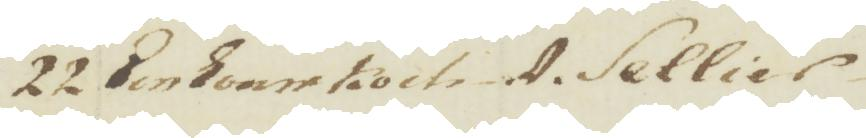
22 Een Rouw koets A. Sellier
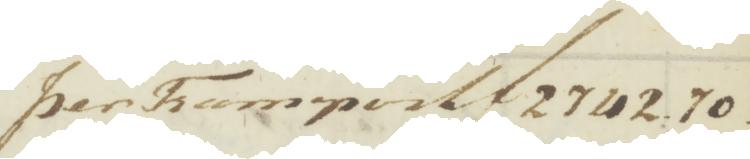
per Transport ƒ 2742.70
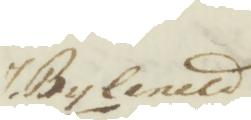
I. Byleveld
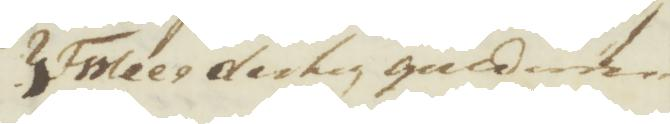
Twee & dertig guldens.
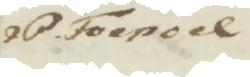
& P. Toepoel
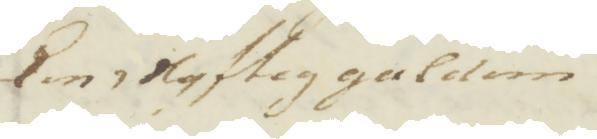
Een & Vyftig guldens
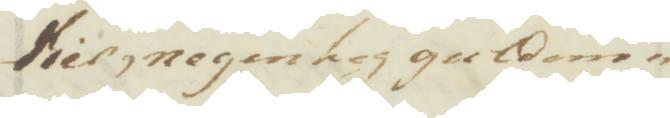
Vier & negentig guldens
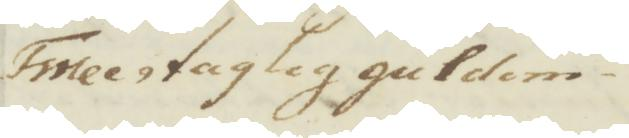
Twee & tagtig guldens -
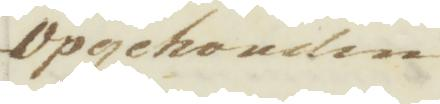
Opgehouden
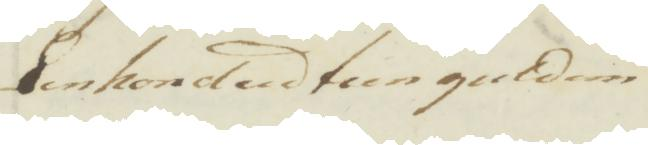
Een honderd tien guldens
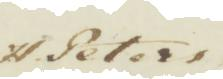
H. Peters
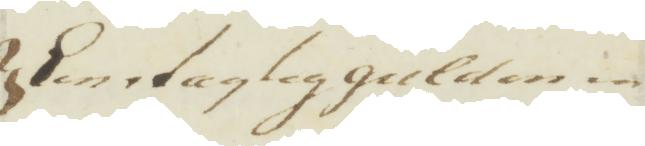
Een tagtig gulden . . .
